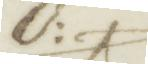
O:
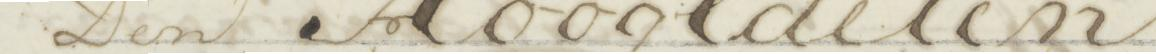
Den Hoog Edelen
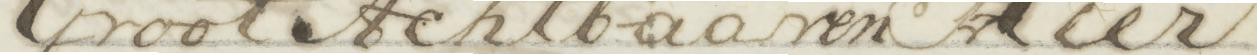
Groot Achtbaaren Heer
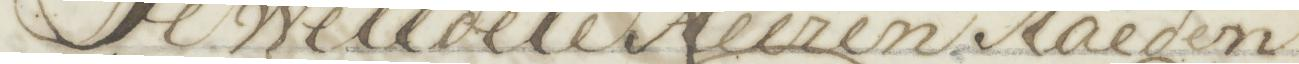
De wel Edele Heeren Raeden
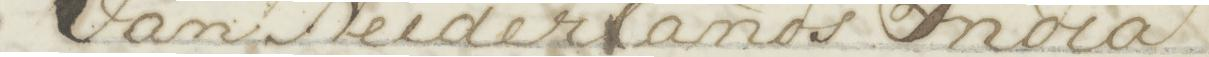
Van Neederlands India
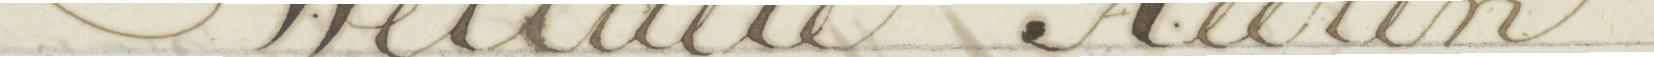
Wel Edele Heeren
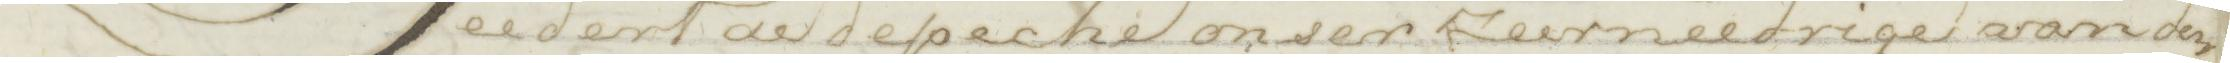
Seedert de depeche onser zeer needrige van den
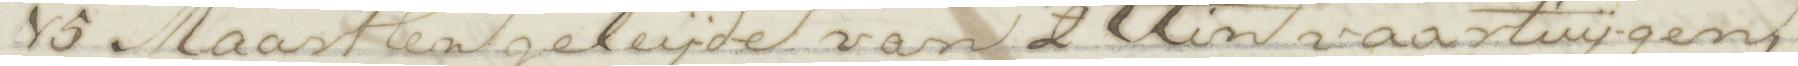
15 Maart hen geleijde van 2 thin vaartuijgen
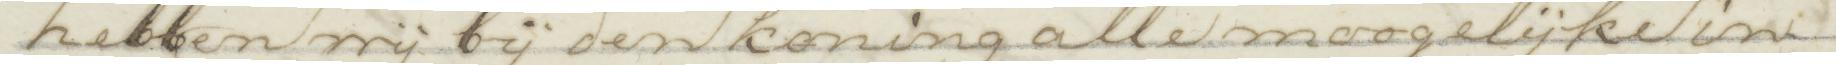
hebben wij bij den koning alle moogelijke in
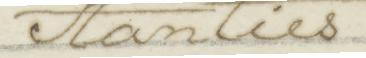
Stanties
